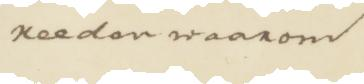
reeden waarom
